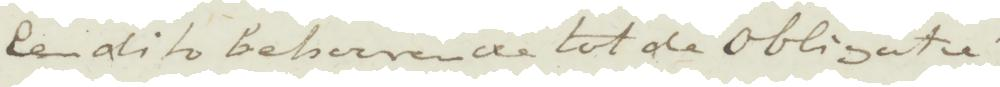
Een dito behoorende tot de Obligatie
